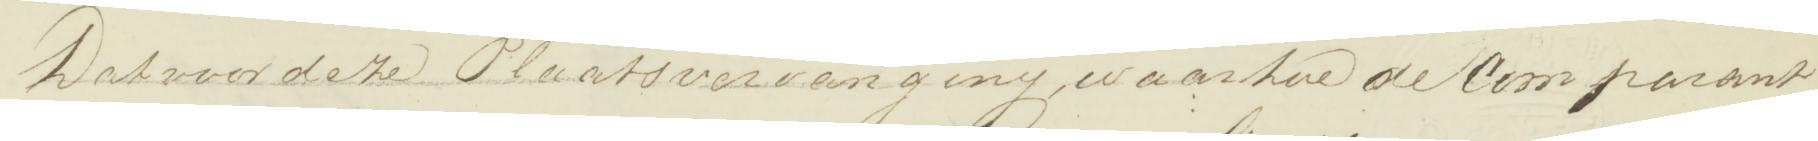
Dat voor deze Plaatsvervanging, waar toe de Comparant
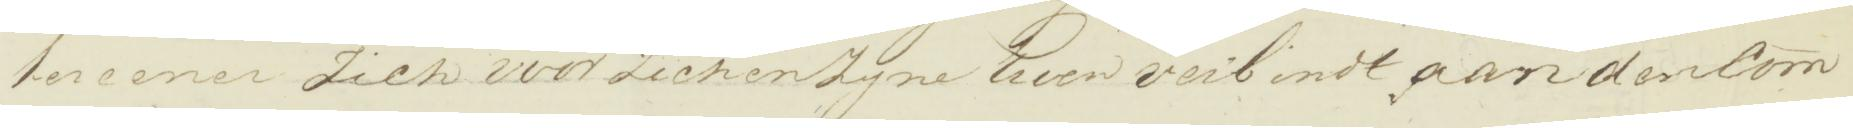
ter eener zich voor zich en zyne Erven verbindt aan den Com
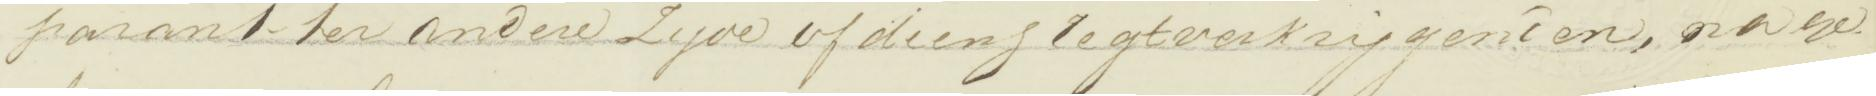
parant ter andere zyde of diens regt verkrygenden, na ge
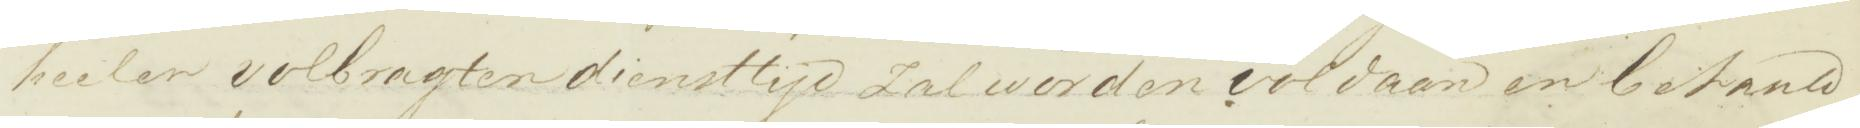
heelen volbragten diensttijd zal worden voldaan en betaald
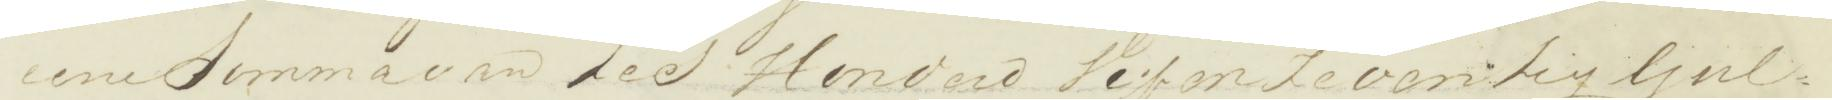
eene Somma van Zes Honderd Vyf en Zeventig Gul„
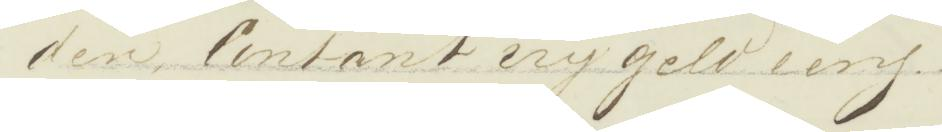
den Contant vrij geld eens.
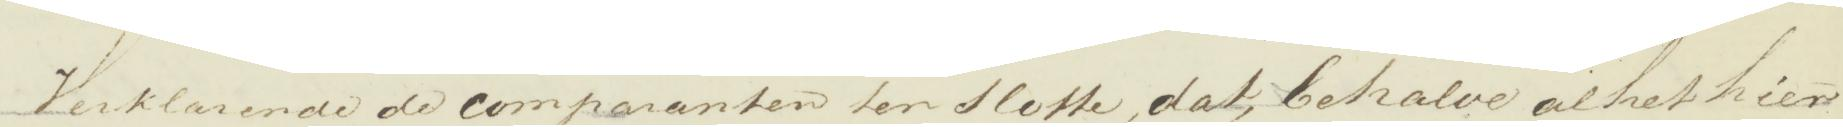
Verklarende de comparanten ten slotte, dat behalve al het hier
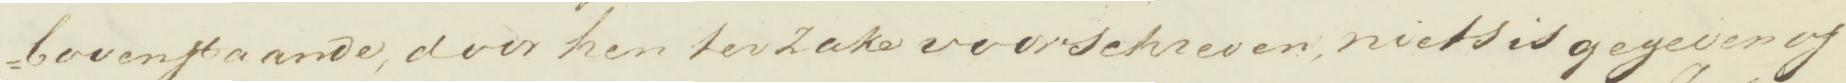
bovenstaande, door hen ter zake voorschreven, niets is gegeven of
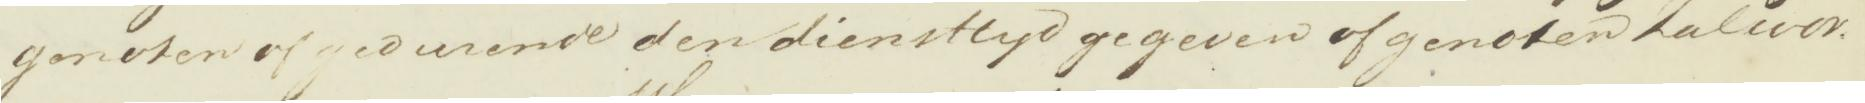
genoten of gedurende den diensttyd gegeven of genoten zal wor„
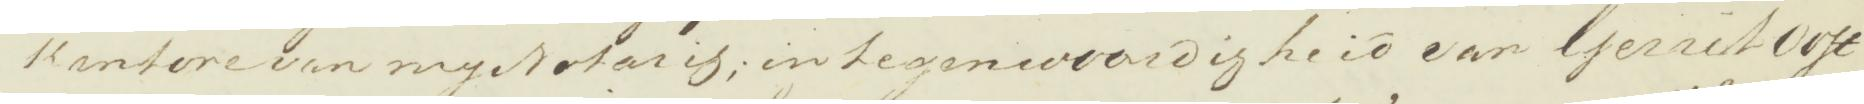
kantore van my Notaris; in tegenwoordigheid van Gerrit Oost
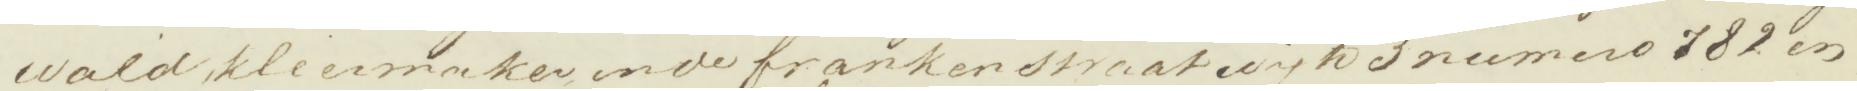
wald, kleermaker, in de frankenstraat wijk 3 numero 782 en
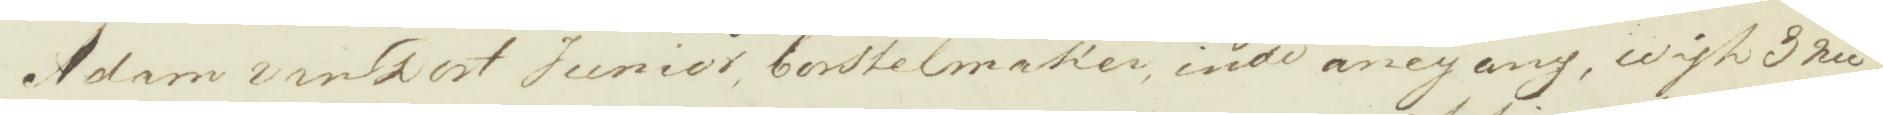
Adam van Dort Junior, borstelmaker, inde anegang, wijk 3 nu
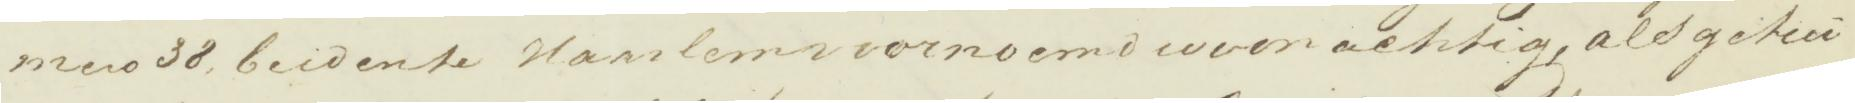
mero 38, beiden te Haarlem voornoemd woonachtig, als getui
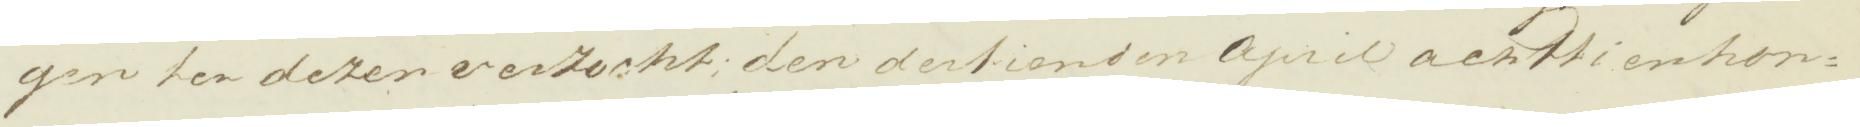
gen ten dezen verzocht; den dertienden April achttienhon=
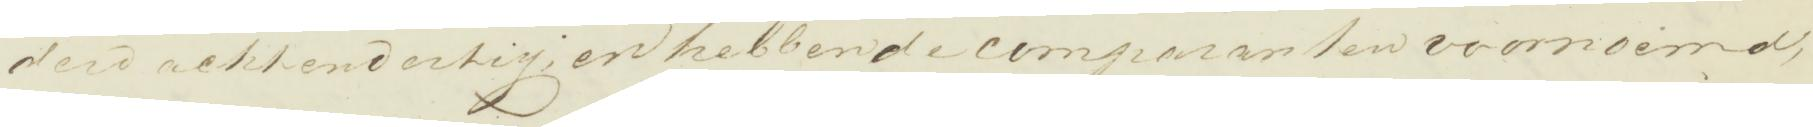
derd acht endertig, en hebben de comparanten voornoemd,
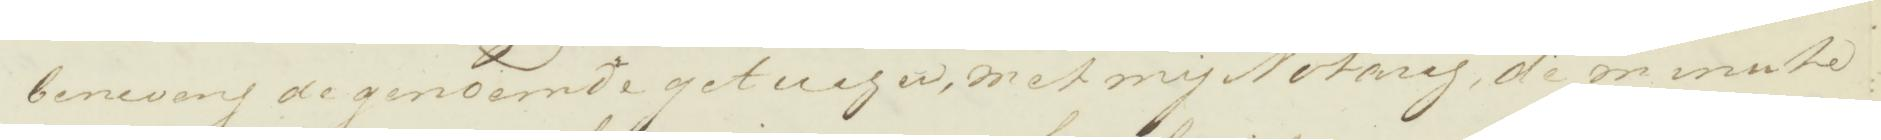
benevens de genoemde getuigen, met mij Notaris, de minute
